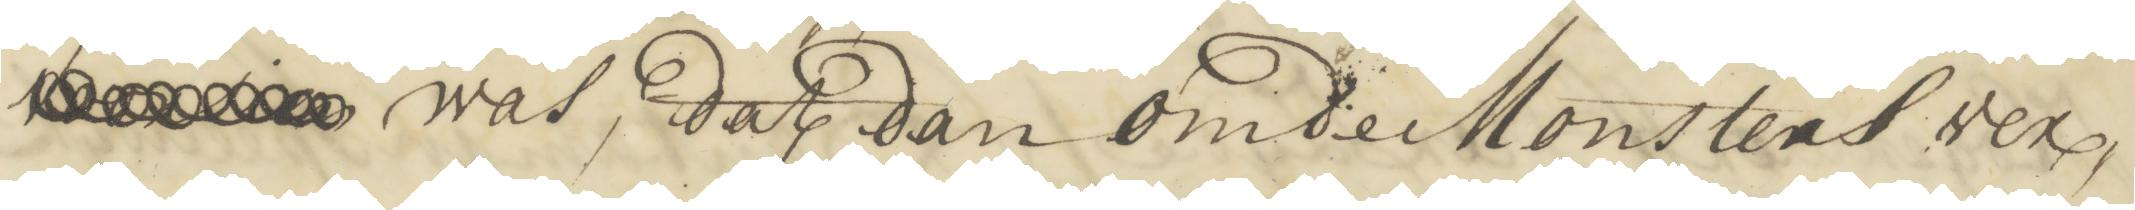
voorsien was, dat dan om de Monsters ver„
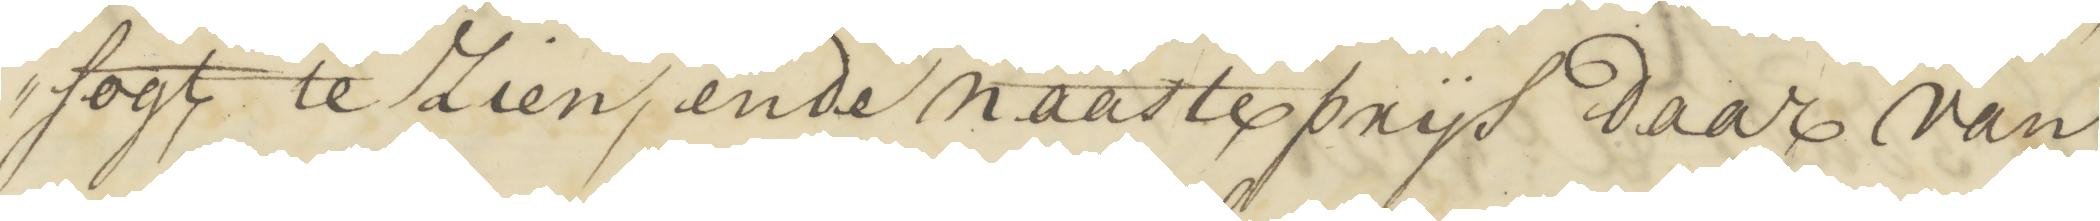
„sogt te zien, ende naaste prijs daar van
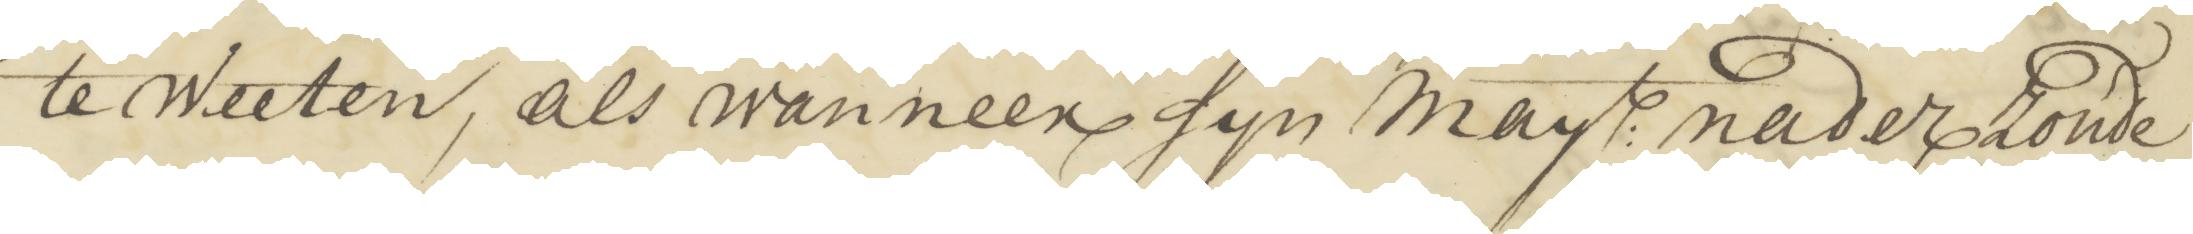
te weeten, als wanneer sijn may:t nader zoude
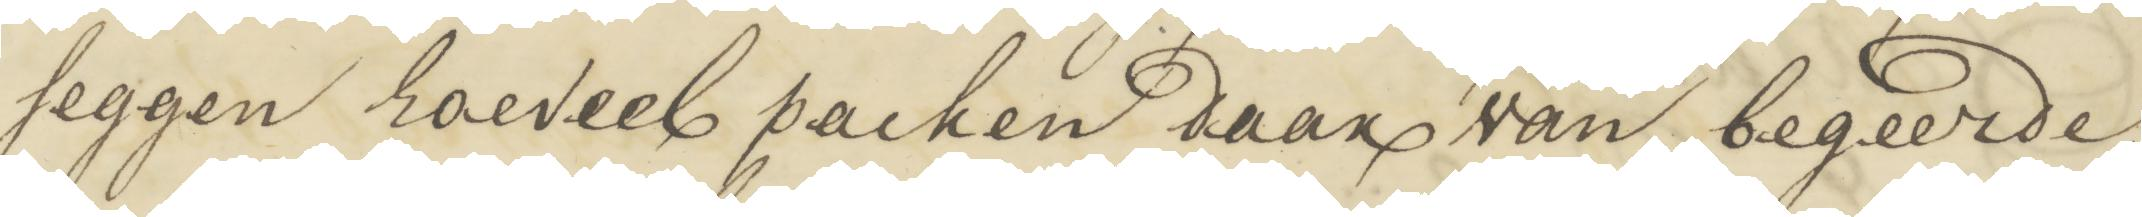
seggen hoeveel packen daar van begeerde,
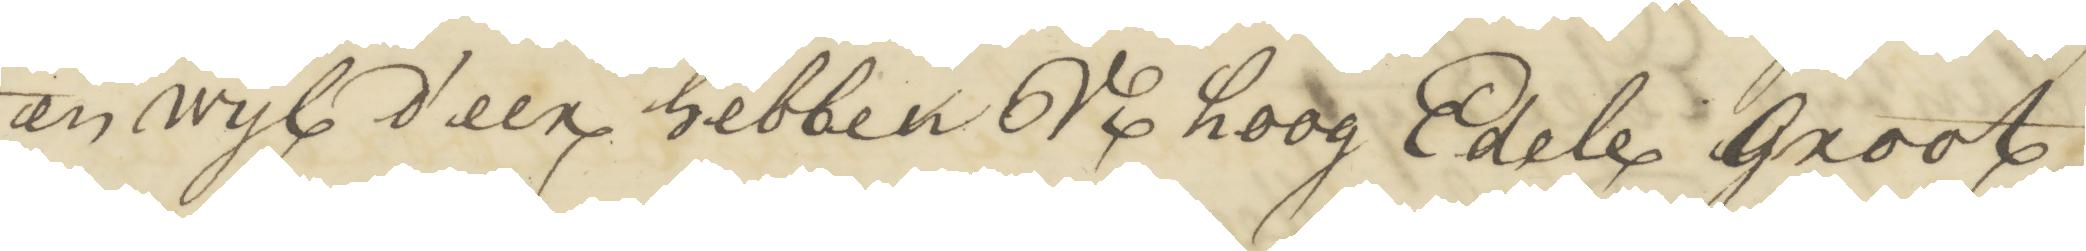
en wijl d’eer hebben UE hoog Edele groot
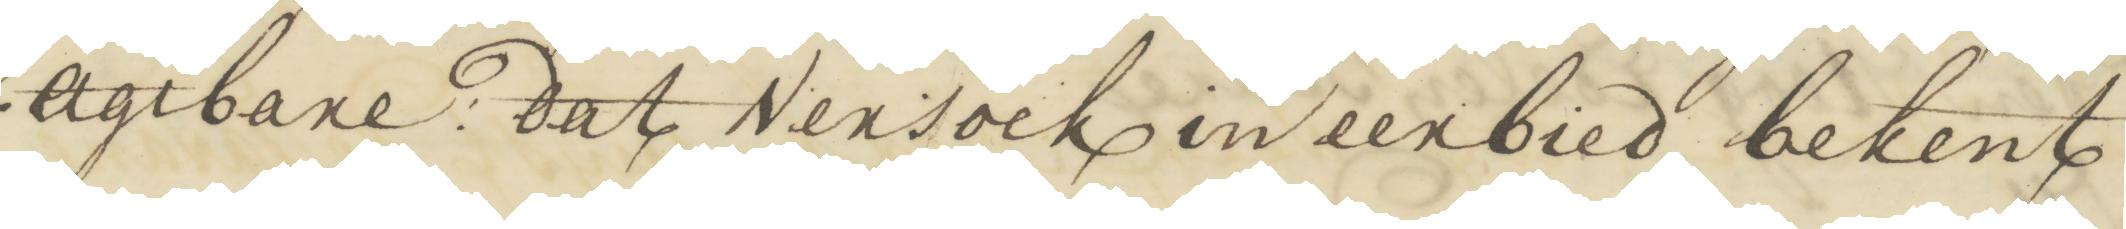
agtbare: dat versoek in eerbied bekent
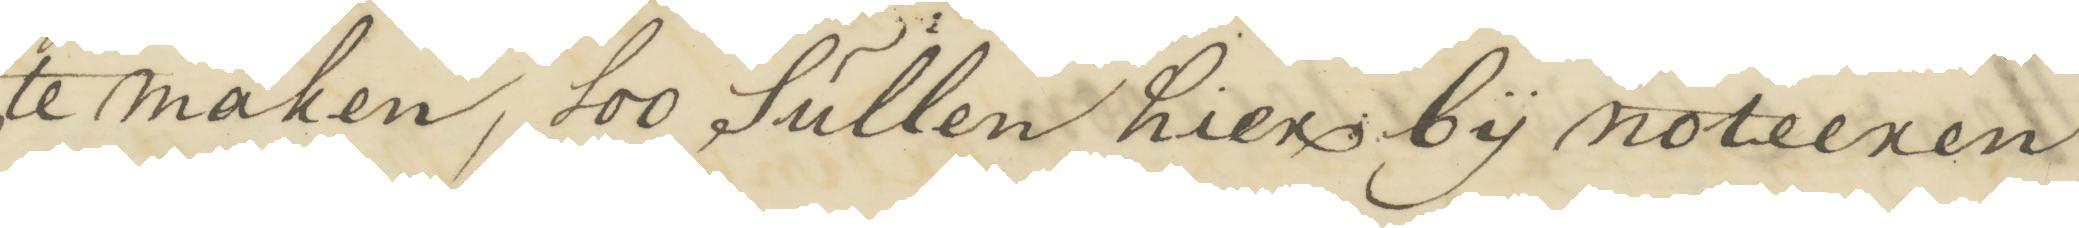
te maken, soo sullen hier bij noteeren
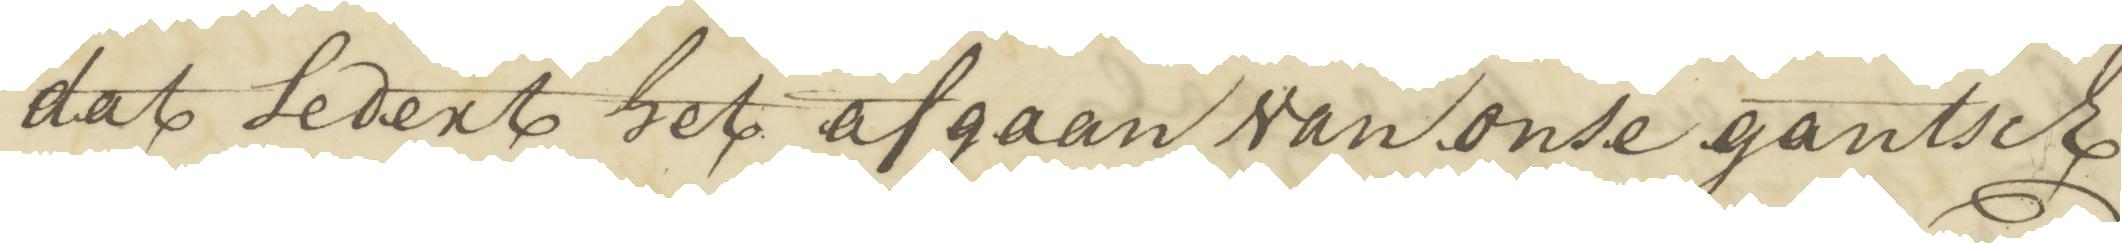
dat sedert het afgaan van onse gantsch
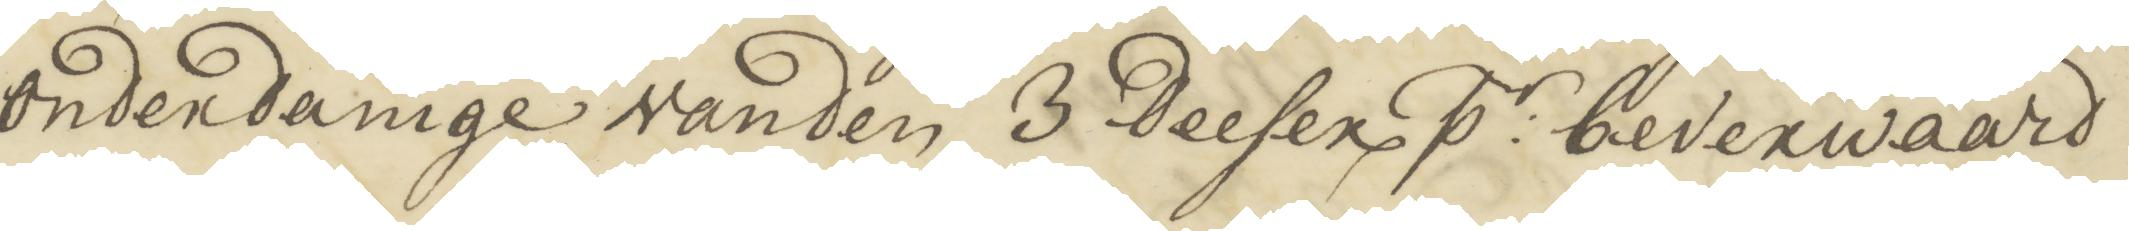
onderdanige van den 3 deeser p:r beverwaard
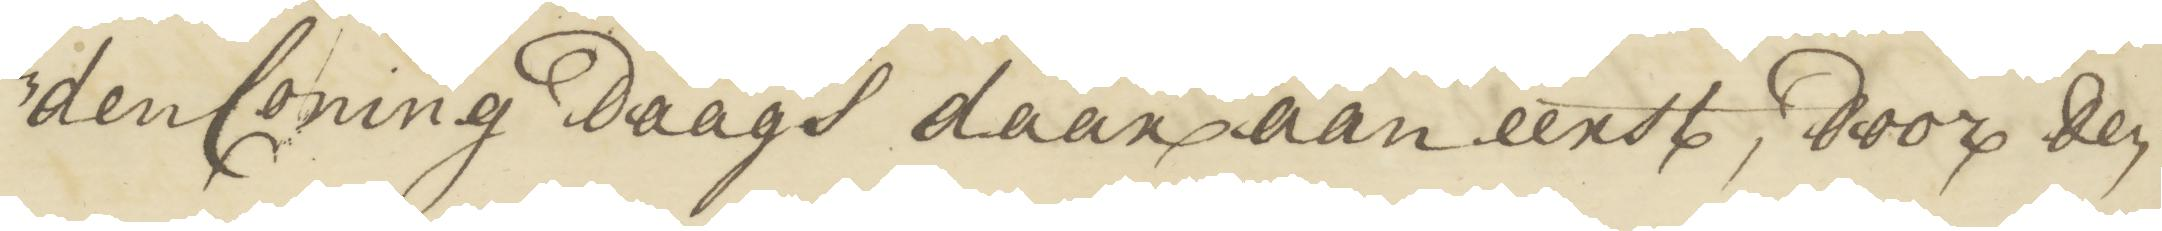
den Coning daags daar aan eerst, door den
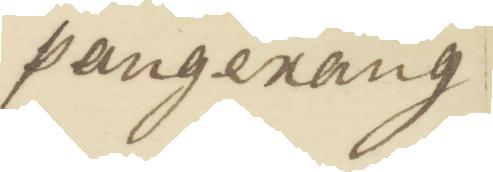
pangerang
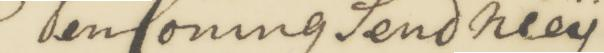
den Coning send nieij
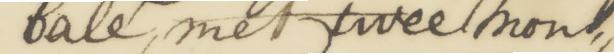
bale, met twee mon„
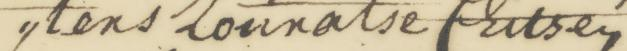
ters zouratse Chitsen
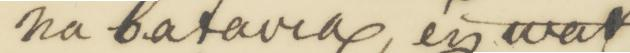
na batavia, en wat
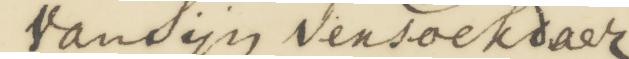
van sijn versoek daer
